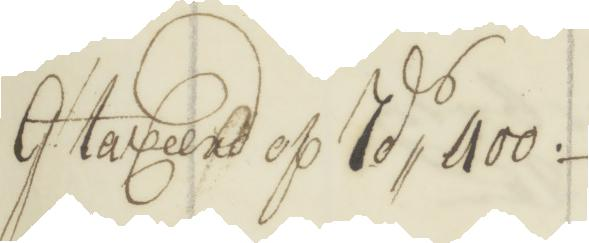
G.'taxeerd op rd„s 400:
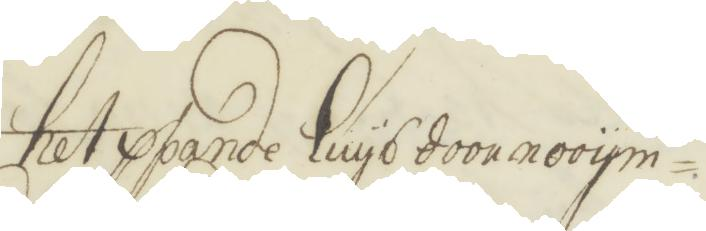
het verpande huijs door rooijm=s
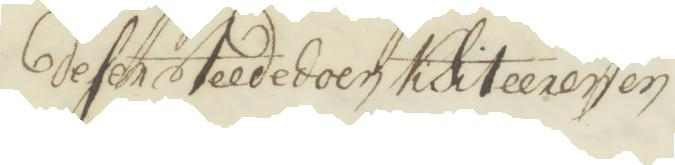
deser steede doen visiteeren en
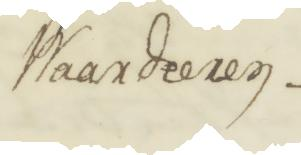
waardeeren
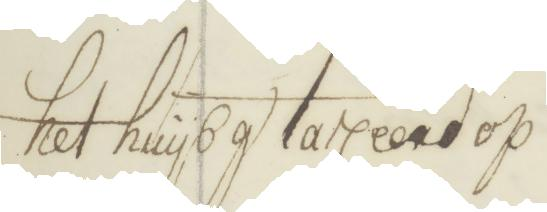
het huijs g'taxeerd op
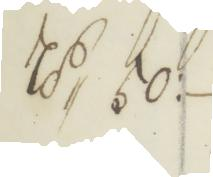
rd„s 50:
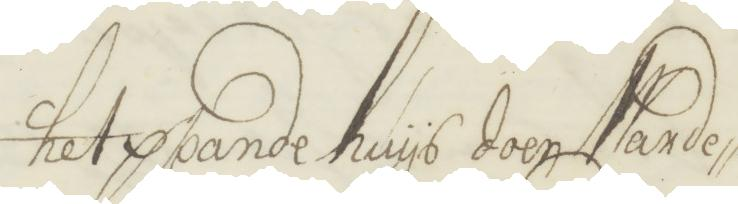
het verpande huijs doen Warde
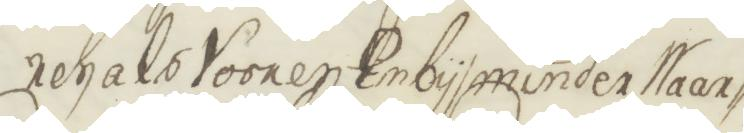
ren als Vooren En bij minder Waar
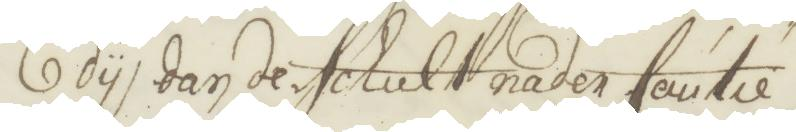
dij dan de schult nader Cautie
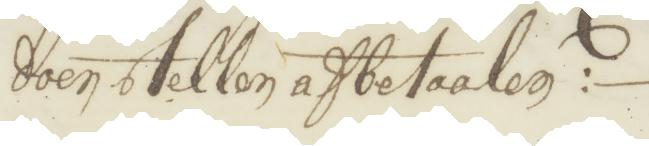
doen stellen afbetaalen: —
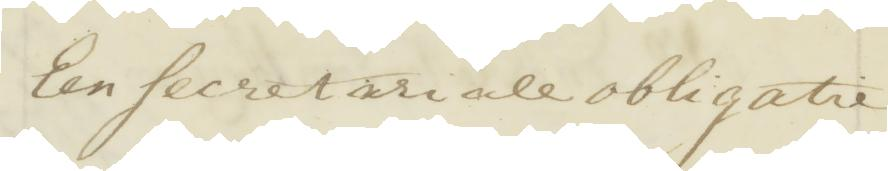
Een secretariale obligatie
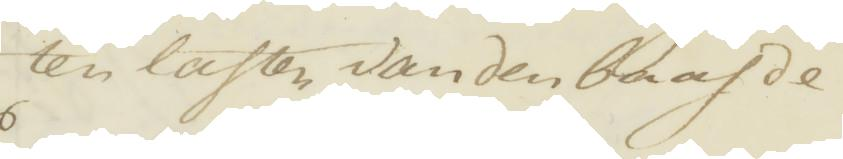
ten lasten van den baas de
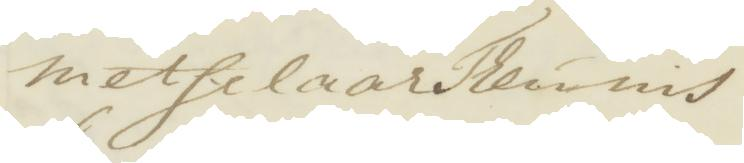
metselaar Theunis
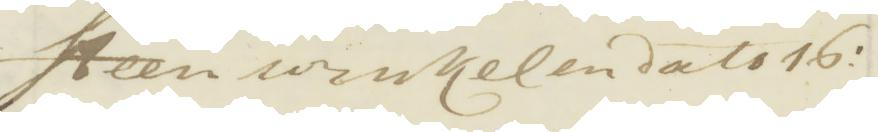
steenwinkel en dato 16:
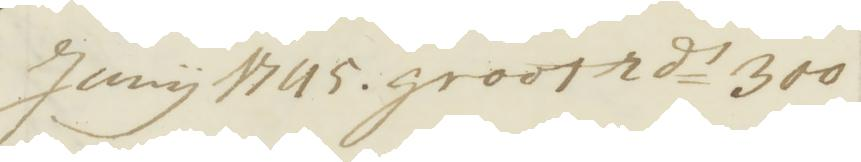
Junij 1745. groot rd=s 300
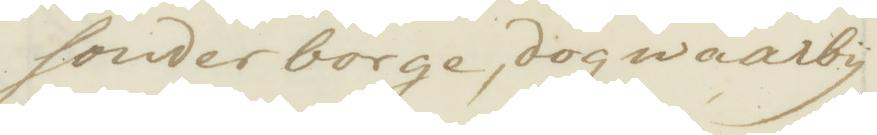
sonder borge, dog waarbij
